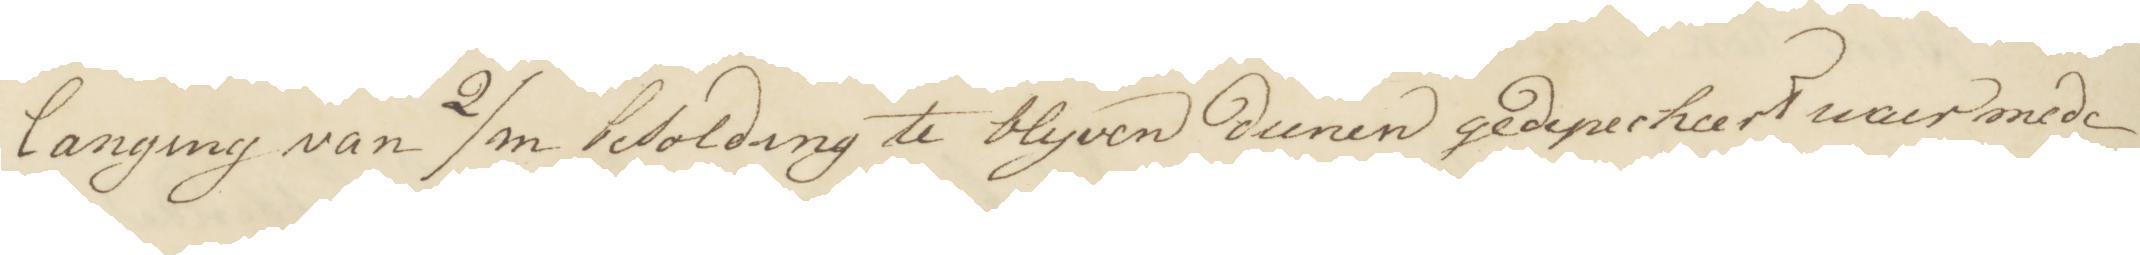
langing van 2/m besolding te blyven dienen gedepecheert waer mede
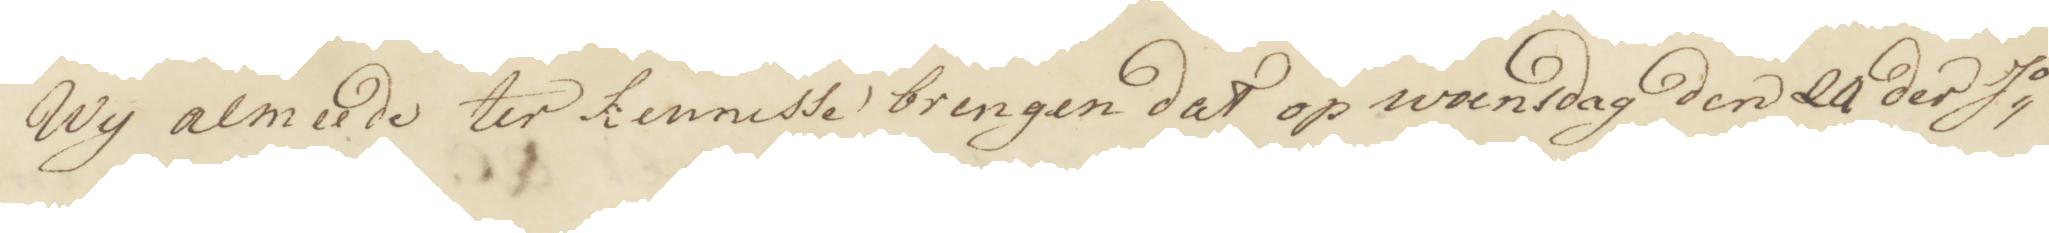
wij almeede ter kennisse brengen dat op woensdag den 24 der J„o
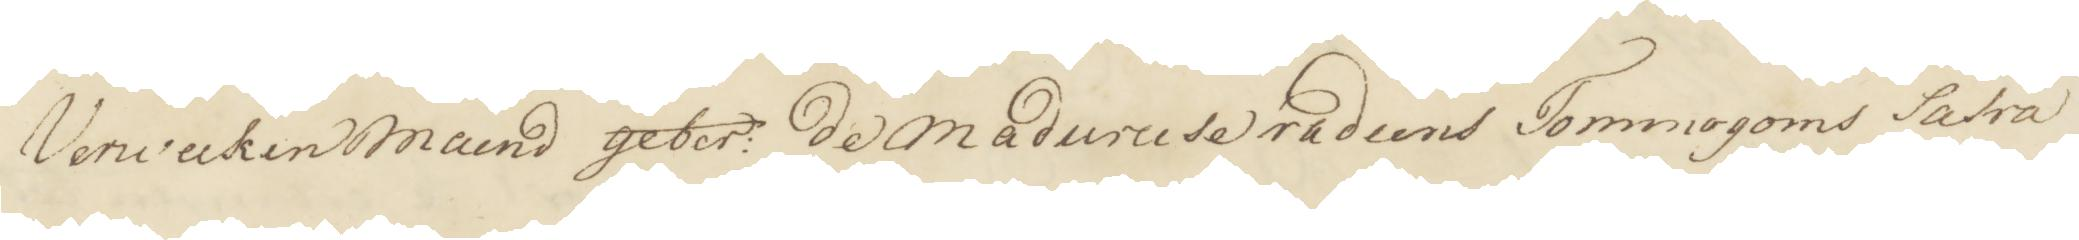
Verweeken maend geber: de maduruse radeens Tommogoms sasra
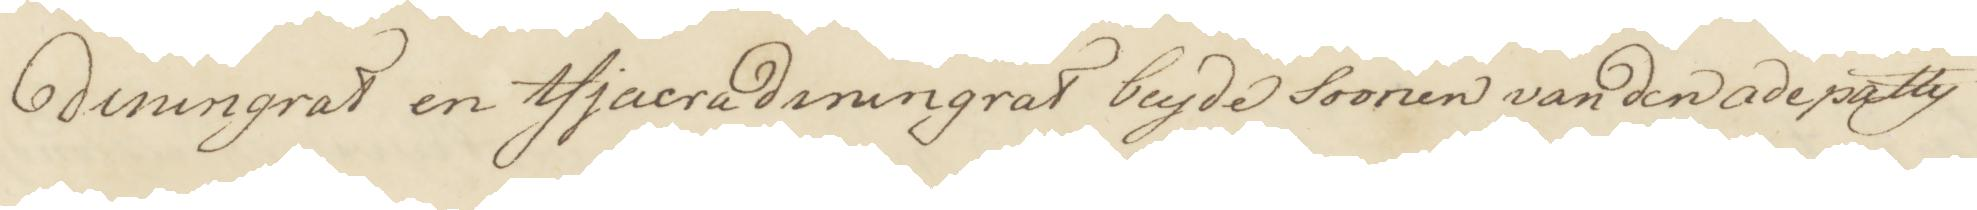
diningrat en tsjacradiningrat beijde soonen van den adepattij
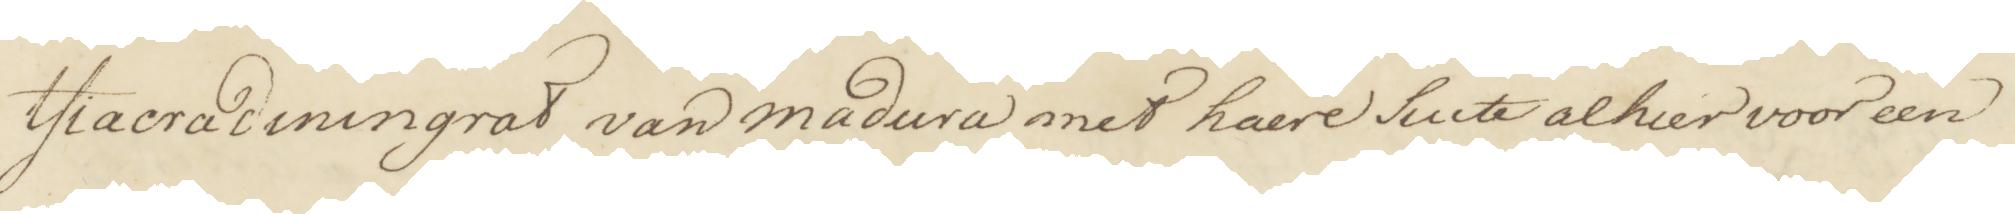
tsiacradiningrat van madura met haere suite alhier voor een
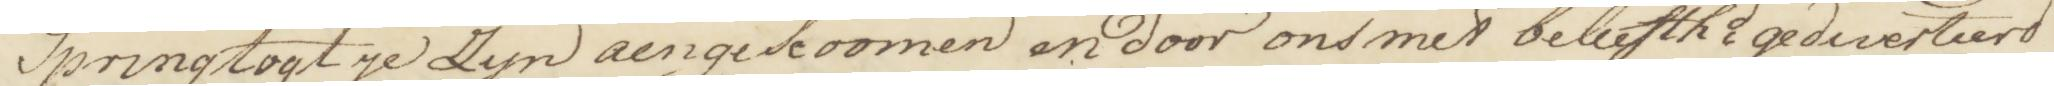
springtogtje zyn aengekoomen en door ons met beleefth:d gediverteerd
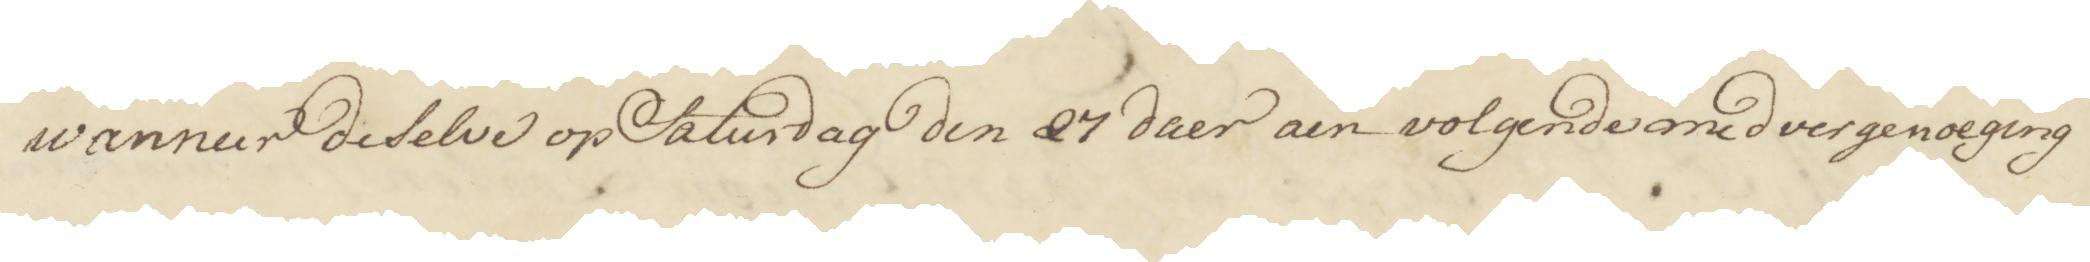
wanneer deselve op Saturdag den 27 daer aen volgende med vergenoeging
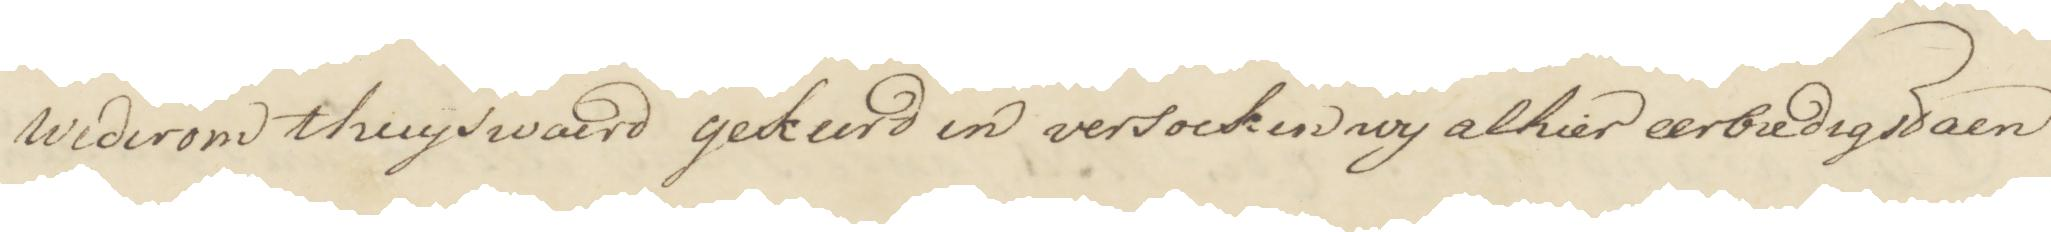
wederom thuijswaerd gekeerd en versoeken wij alhier eerbiedigst aen
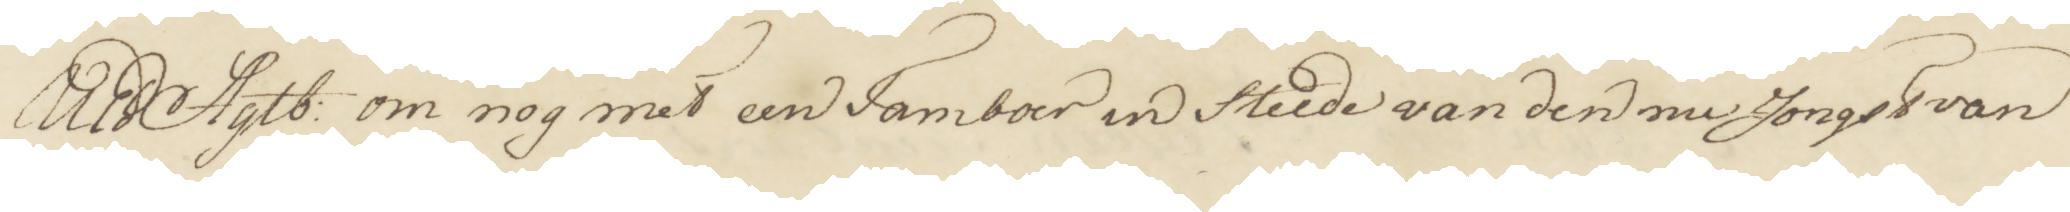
UEd Agtb: om nog met een Tamboer in steede van den nu Jongst van
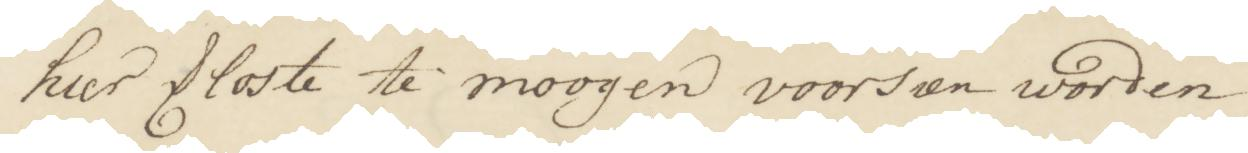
hier verloste te moogen voorsien worden
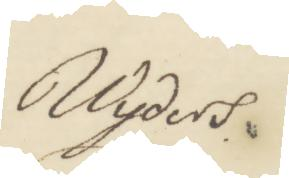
Wyders
